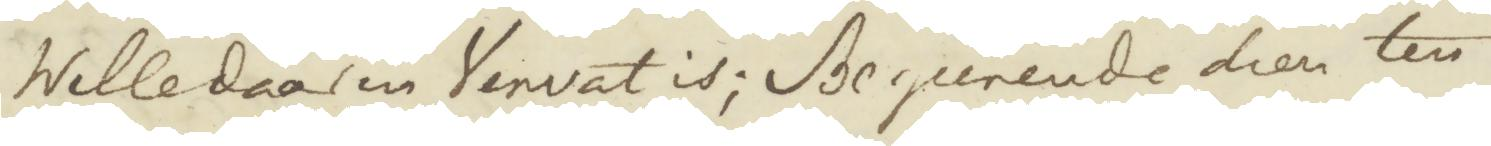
Wille daar in Vervat is; Begeerende dien ten
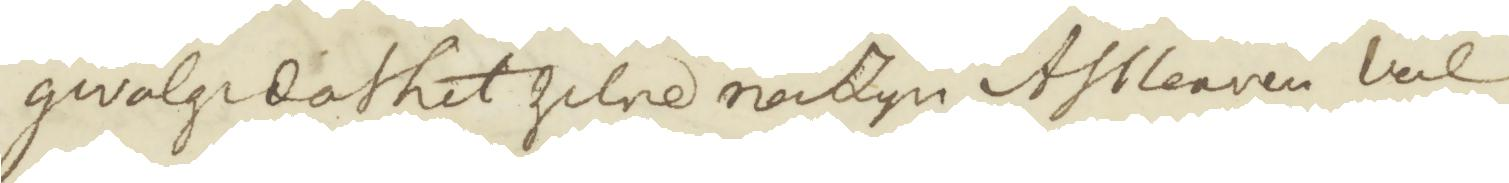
gevolge dat het zelve na zyn Afsterven wel
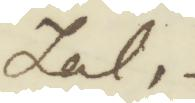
Zal,
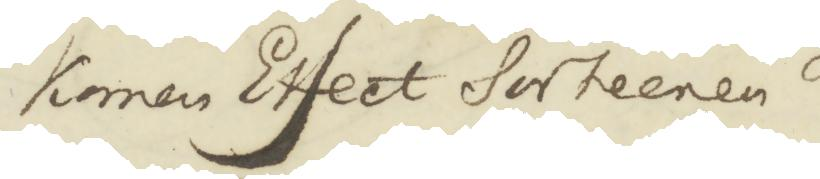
komen Effect sorteeren
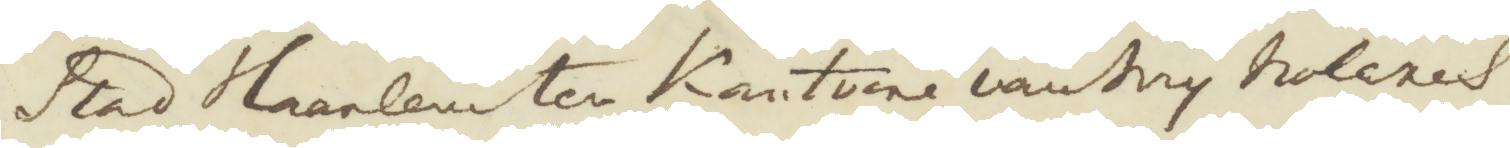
Stad Haarlem ten Kantoore van my Notaris
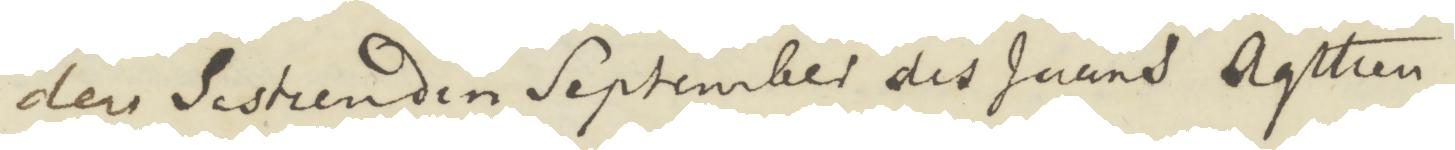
den sestienden september des Jaars Agttien
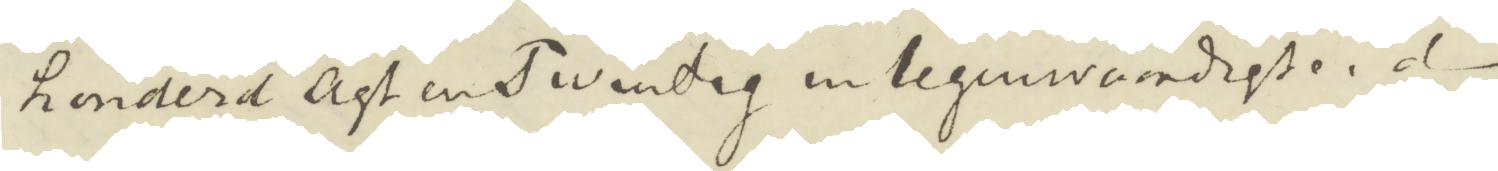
honderd agt en Twintig in tegenwoordigheid
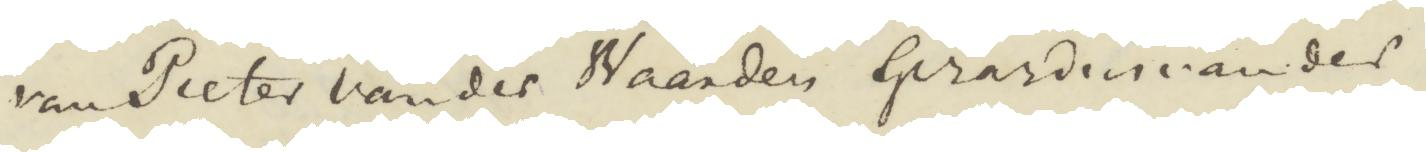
van Pieter van der Waarden Gerardus van der
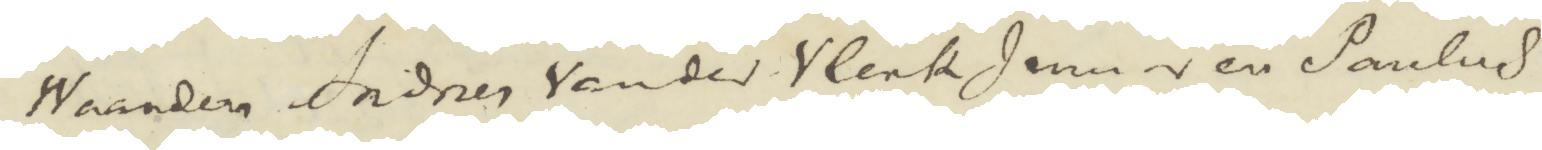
Waarden Andries van der Vlerk Janus en Paulus
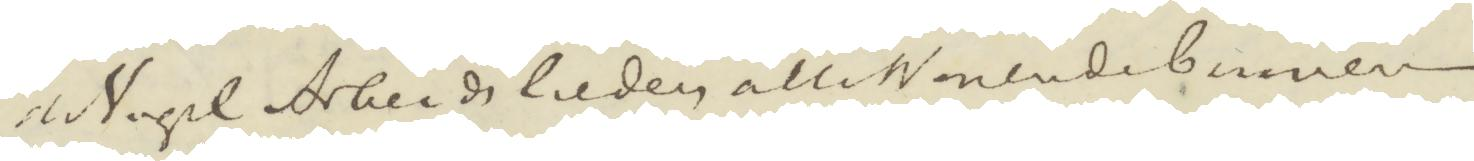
de Vogel Arbeidslieden alle wonende binnen
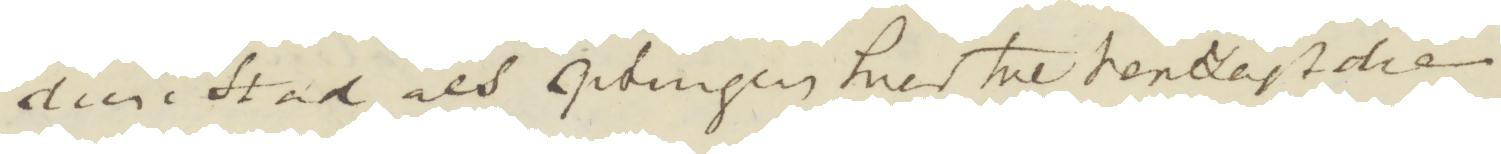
deese stad als getuigen hiertoe verzogt die
